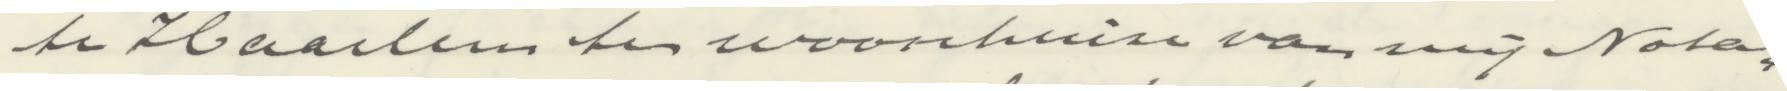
te Haarlem ten woonhuize van mij Nota„
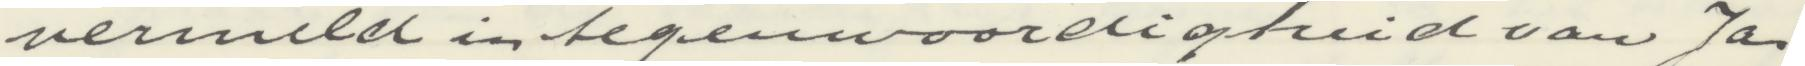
vermeld in tegenwoordigheid van Jan
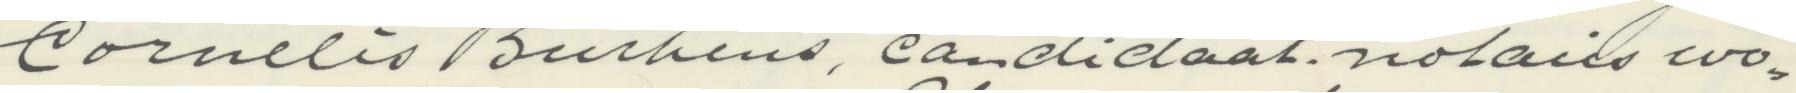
Cornelis Burkens, candicaat. notaris wo„
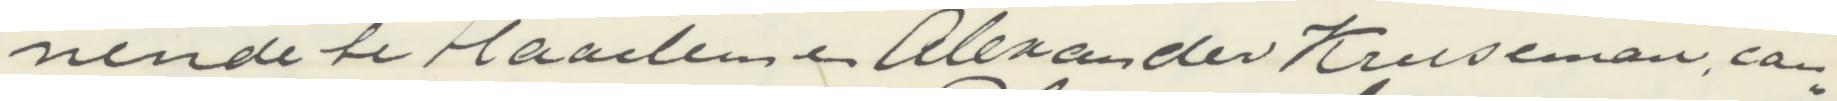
nende te Haarlem en Alexander Kruseman, can„
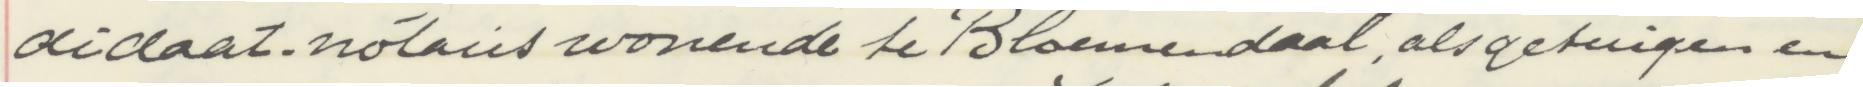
dicaat. notaris wonende te Bloemendaal, als getuigen en
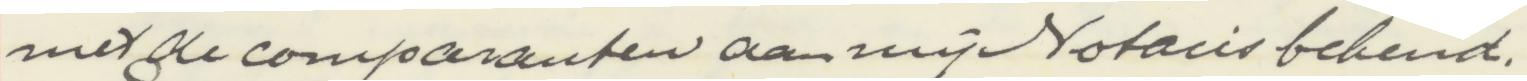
met de comparanten aan mij Notaris bekend.
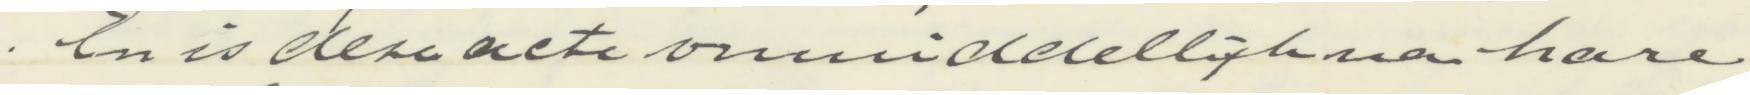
en is deze acte onmiddellijk na hare
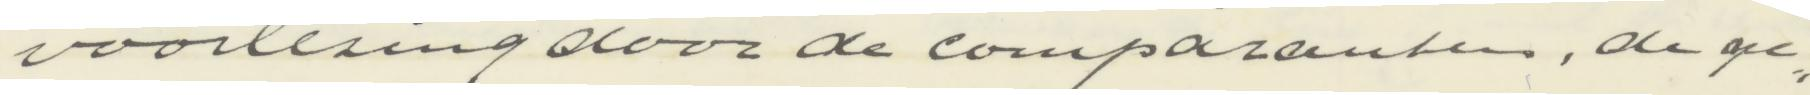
voorlezing door de comparanten, de ge„
